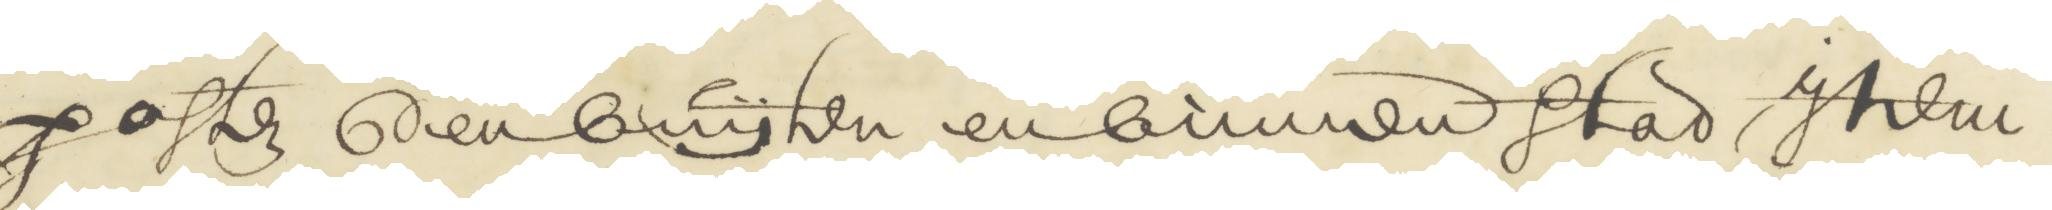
posten der buijten en binnen stad Jtem
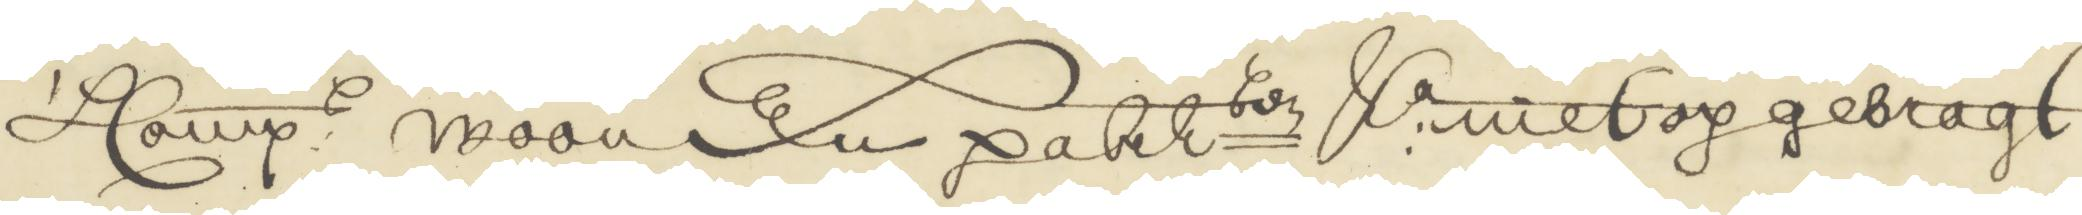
'sComp:s woon En pakh=sen &:a niet opgebragt
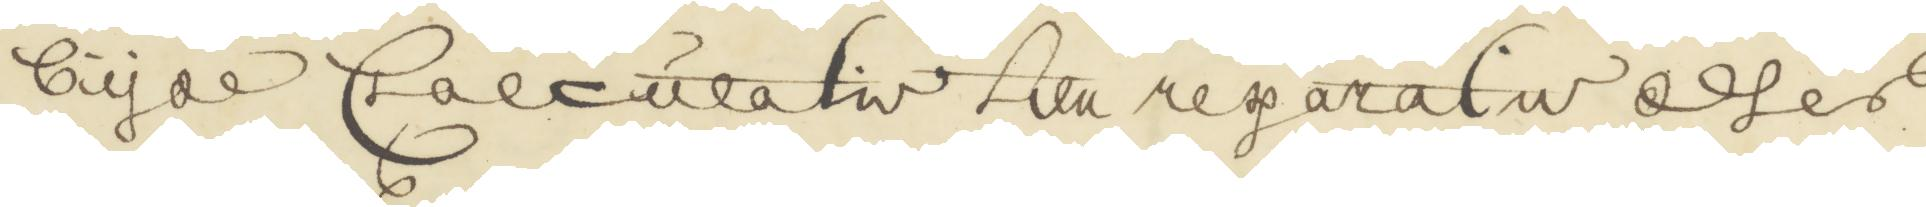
bij de calculatie ter reparatie deses
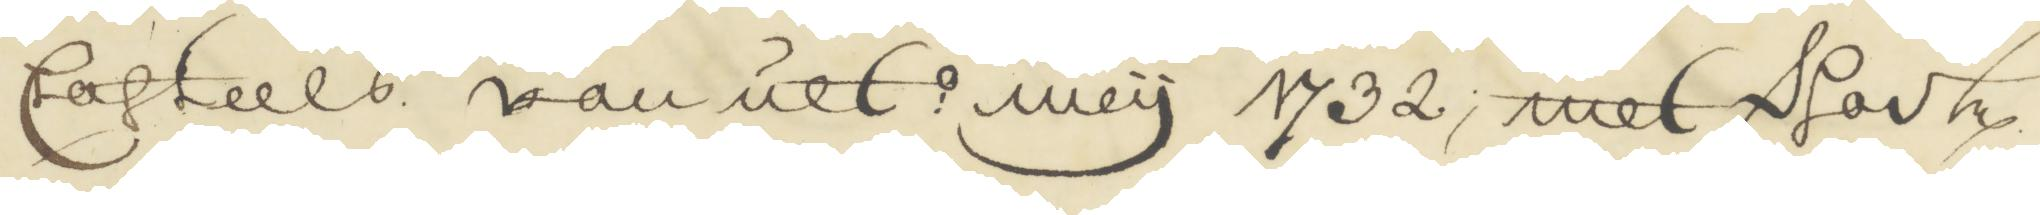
Casteels van ult:o meij 1732; met versoek
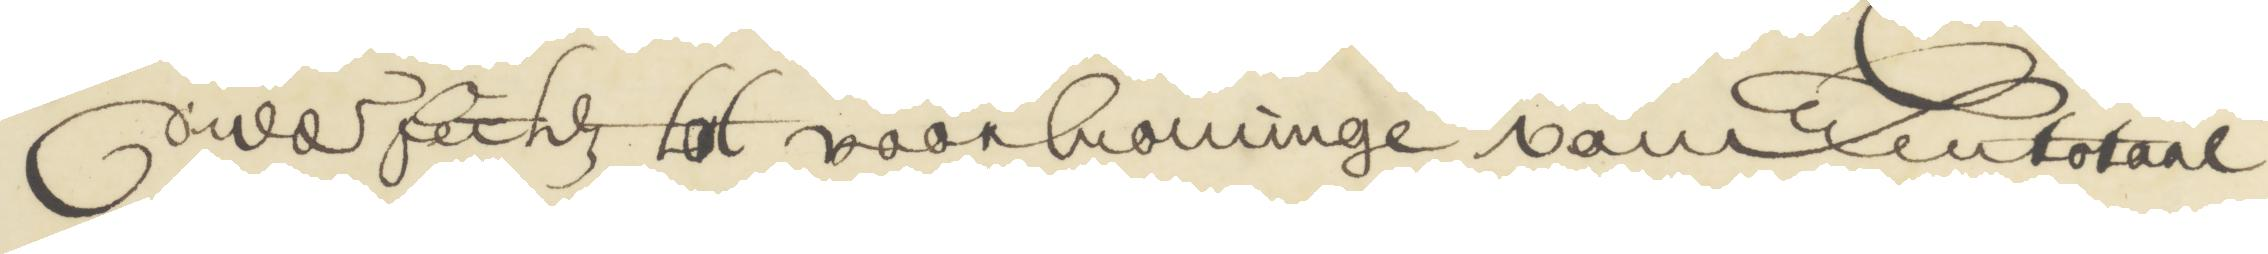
die defecten tot voorkominge van Een totaal
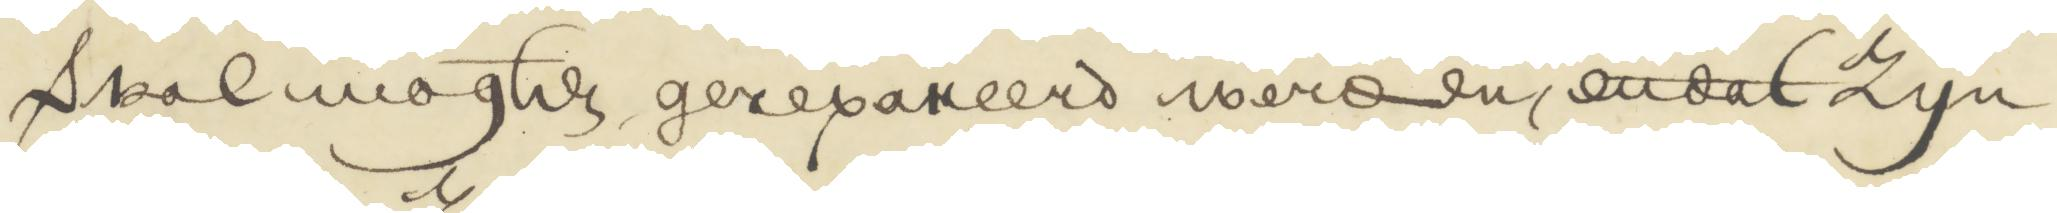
verval mogten gerepareerd werden, en dat zijn
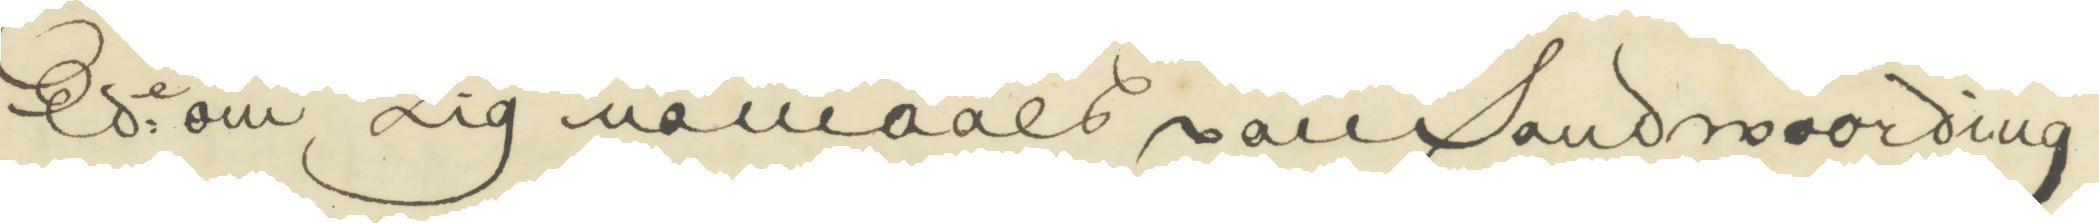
Ed:e om zig namaals van verandwoording
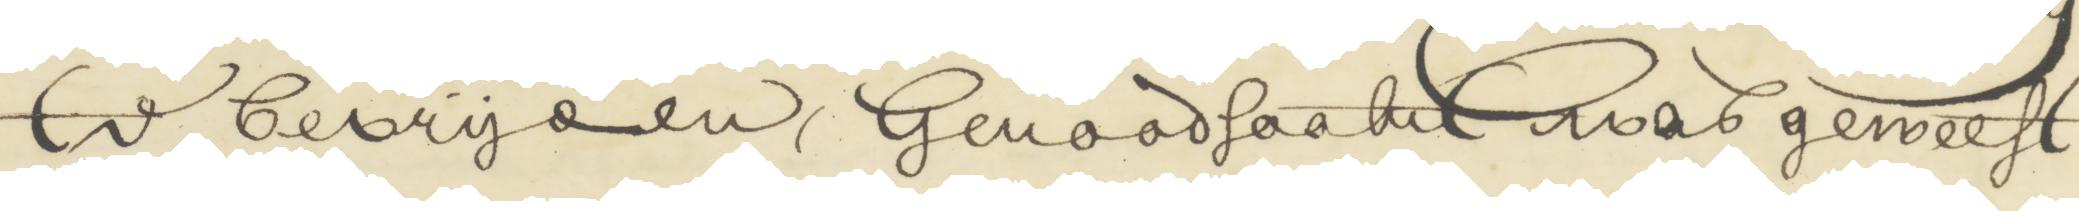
te bevrijden, Genoodsaakt was geweest
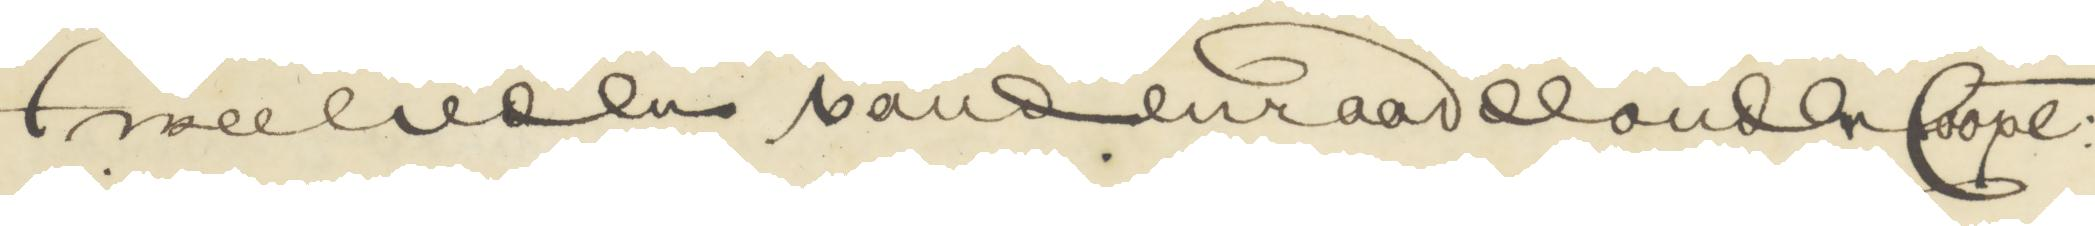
twee leden van den raad de onderCoopl
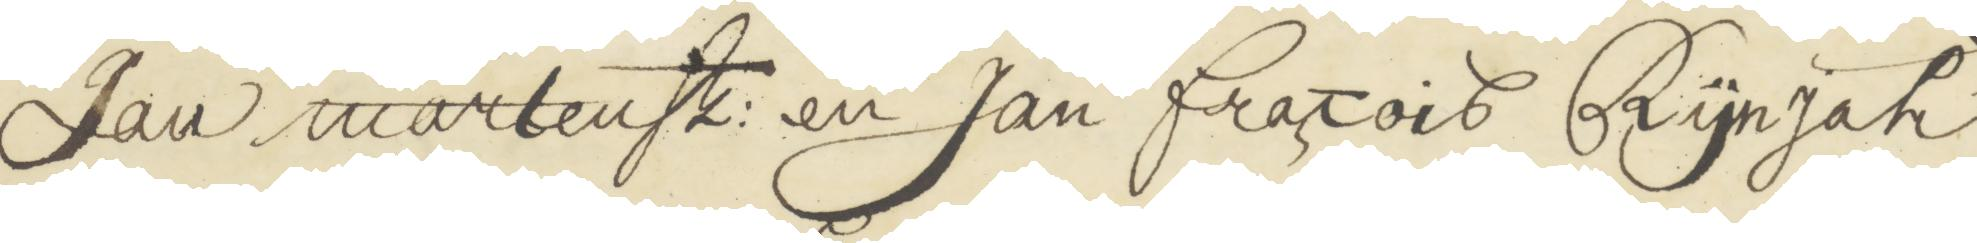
Ian martensz: en Jan fraçois Rijnjak
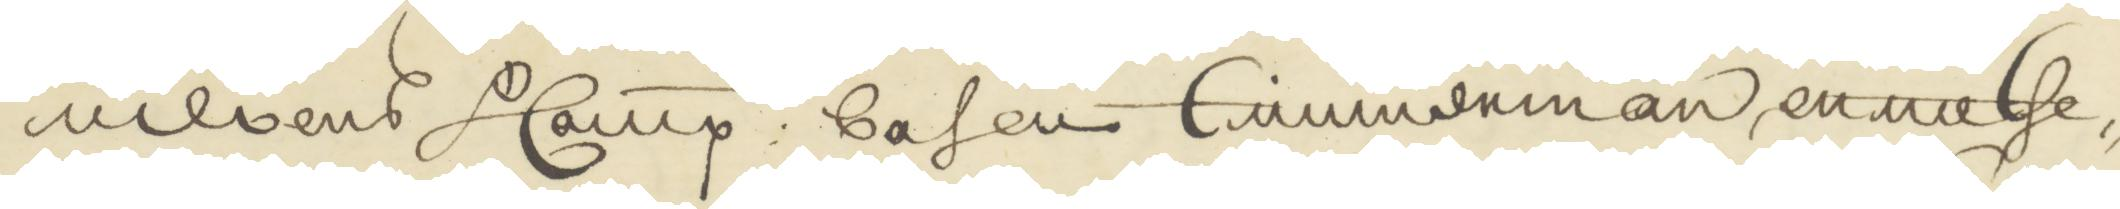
nevens sComp:s basen timmerman, en metse
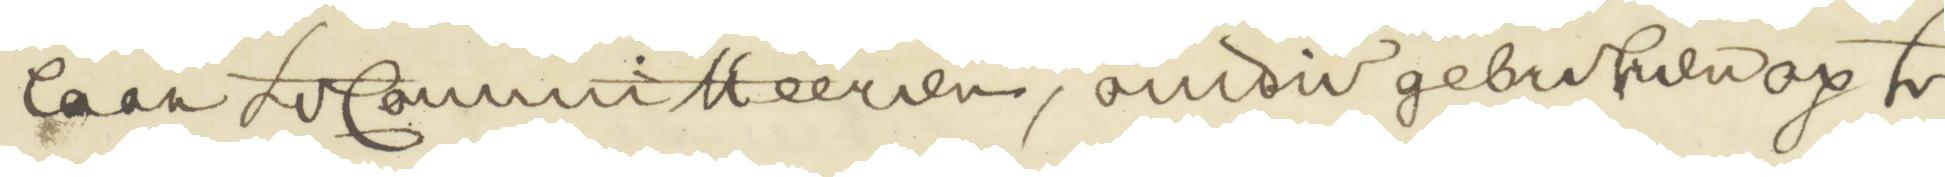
laar te committeeren, om die gebreken op te
